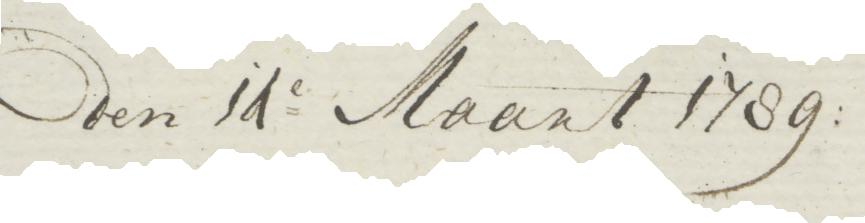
den 14=e Maart 1789:
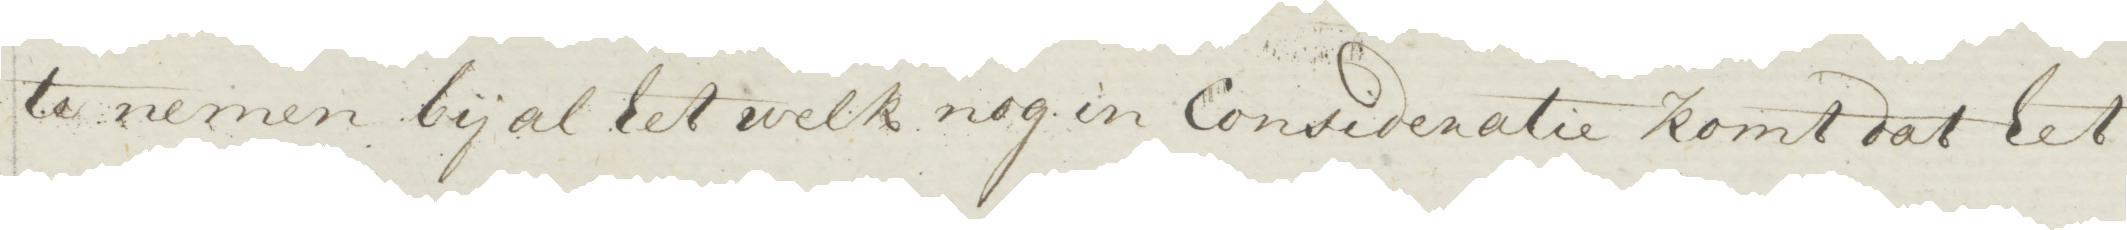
te nemen bij al het welk nog in Consideratie komt dat het
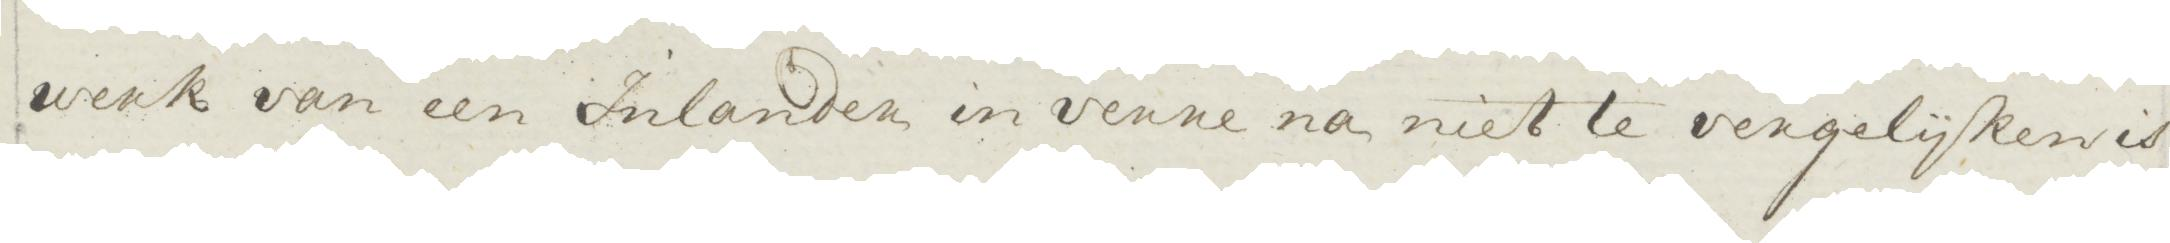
werk van een Inlander in verre na niet te vergelijken is
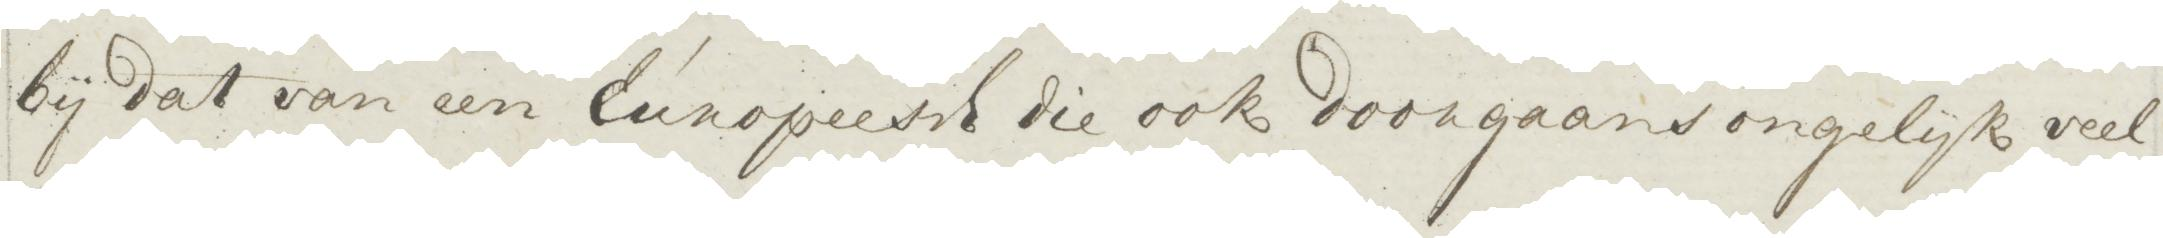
bij dat van een Europeesch die ook doorgaans ongelijk veel
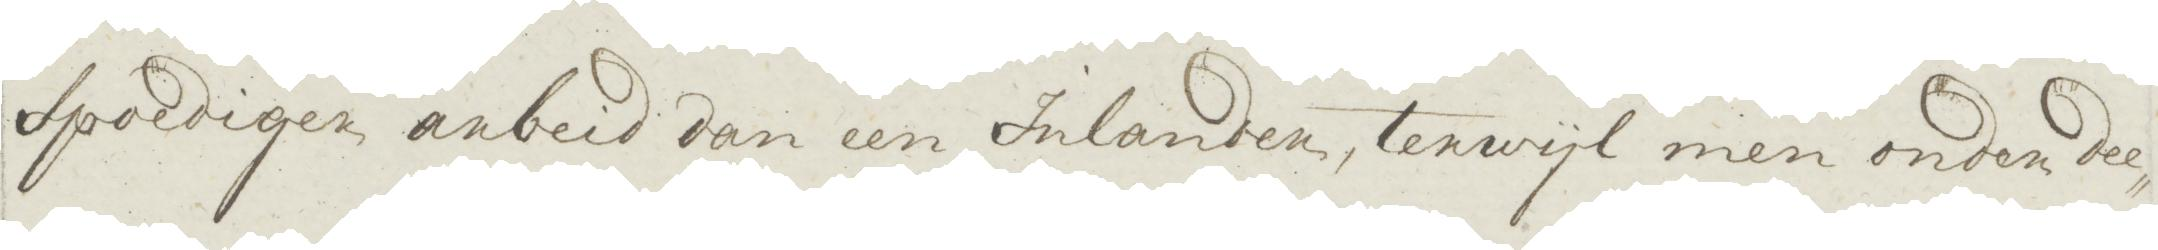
spoediger arbeid dan een Inlander, terwijl men onder dee„
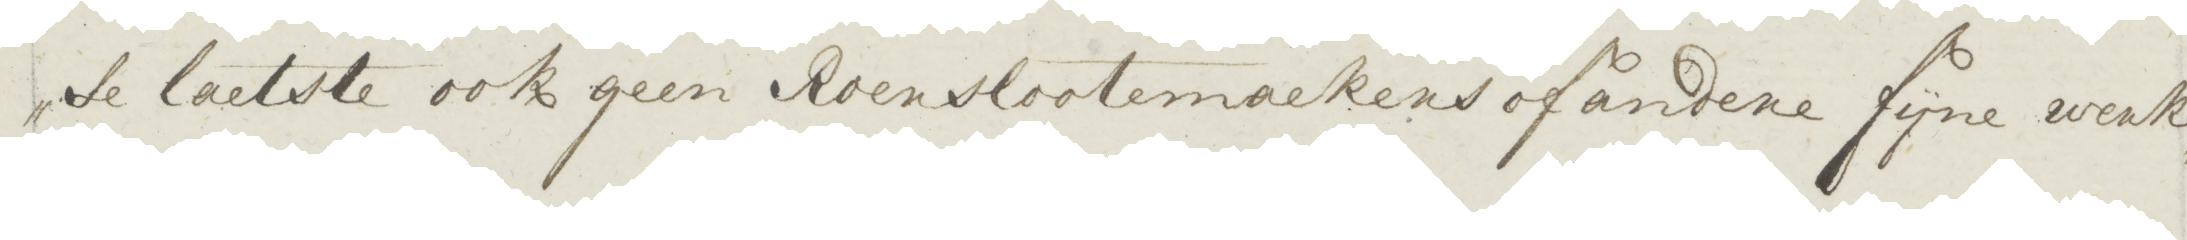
„se laetste ook geen Roerslootemaekers of andere fijne werks„
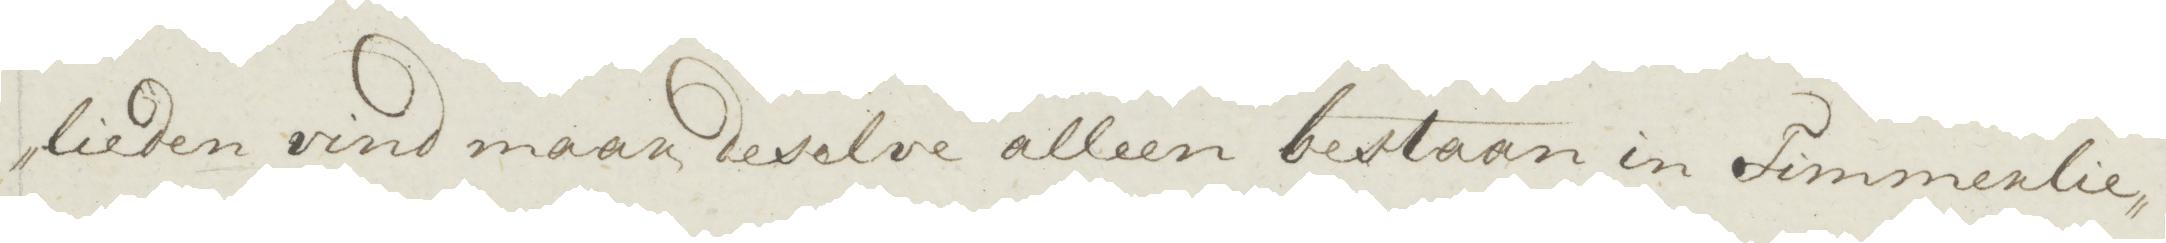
„lieden vind maar deselve alleen bestaan in Timmerlie„
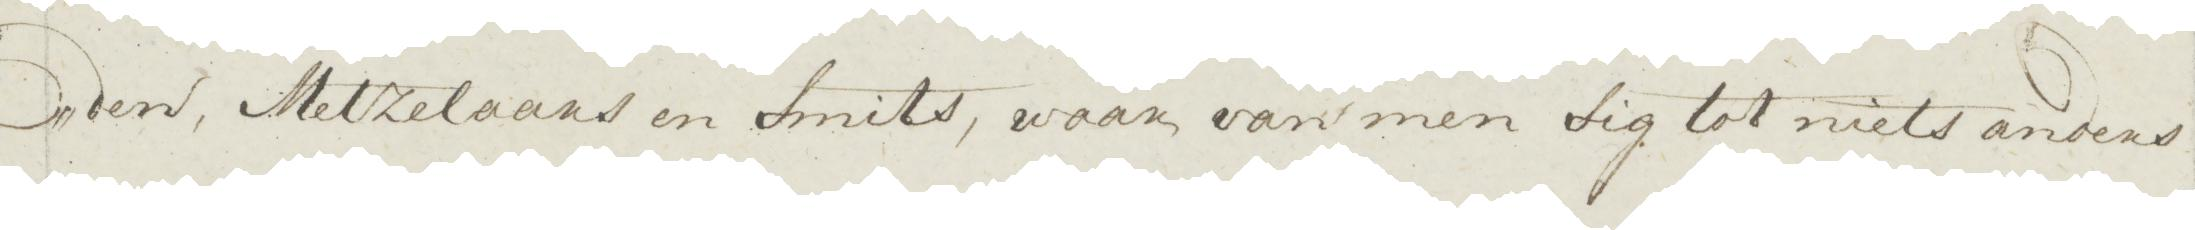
den, Metzelaars en smits, waar van men sig tot niets anders
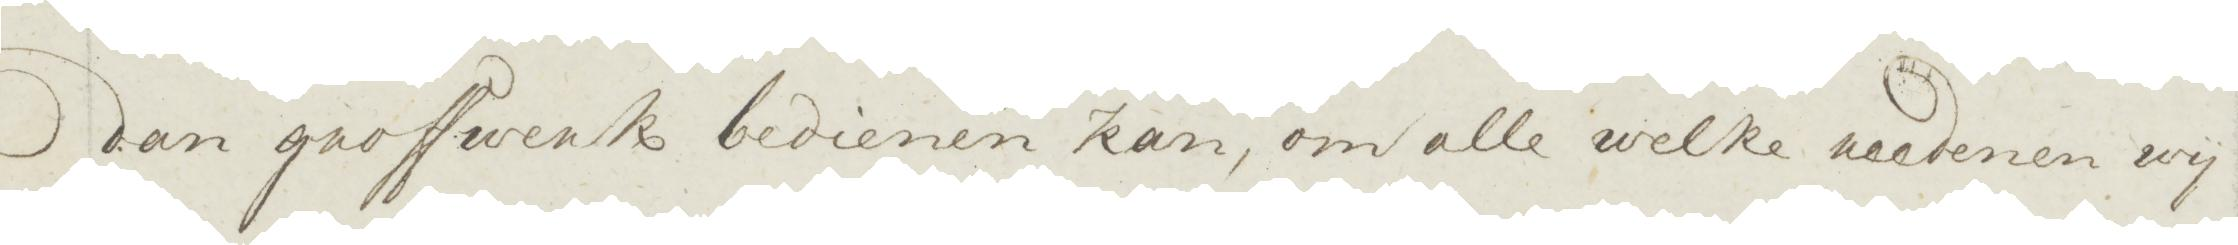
dan groffwerk bedienen kan, om alle welke reedenen wij
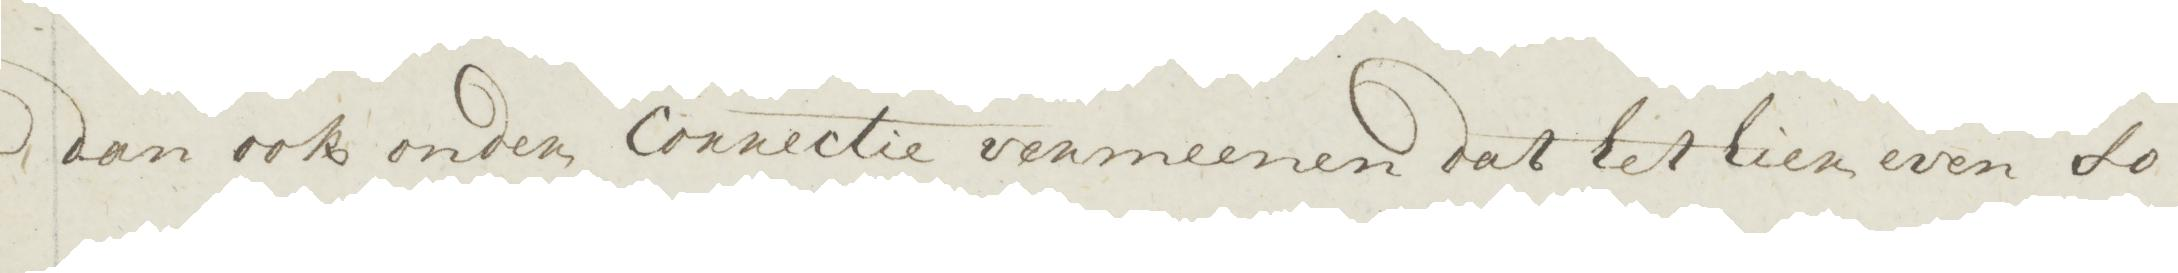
dan ook onder Correctie vermeenen dat het hier even so
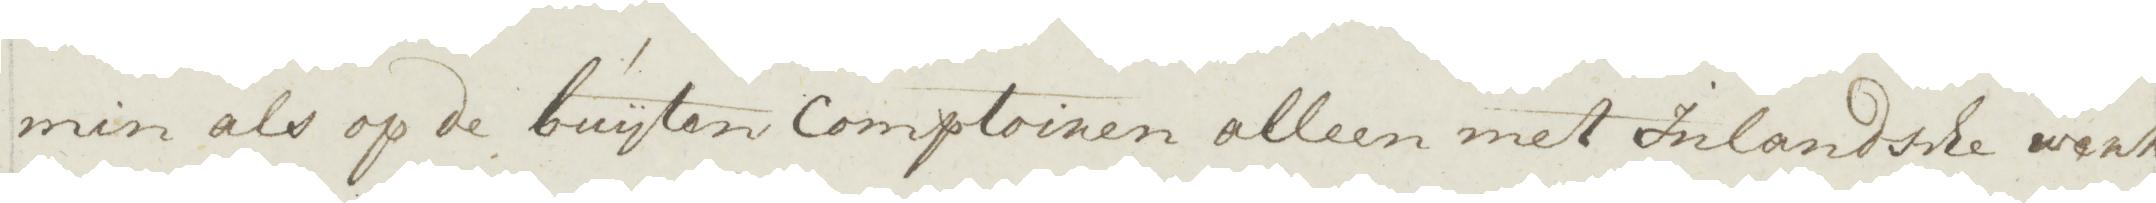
min als op de buijten Comptoiren alleen met Inlandsche werk
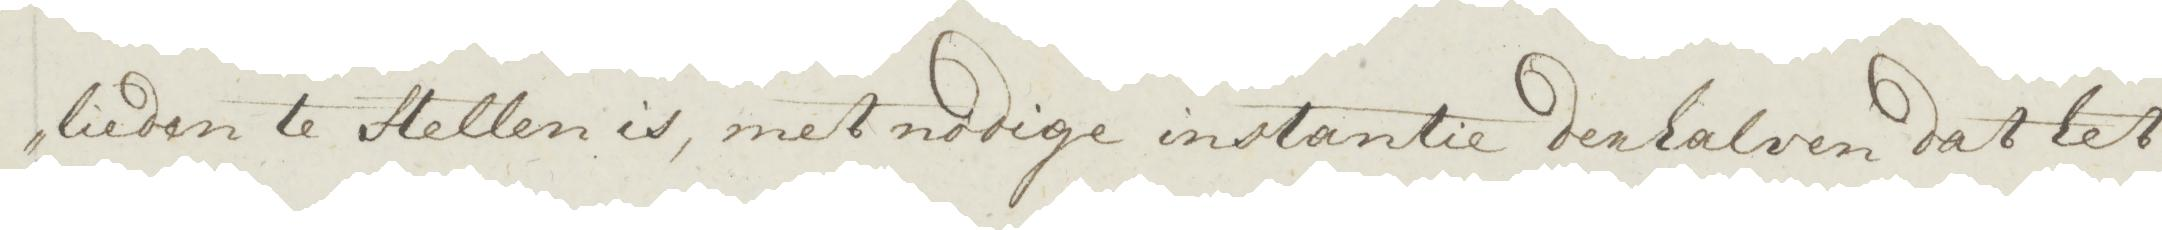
„lieden te stellen is, met nodige instantie derhalven dat het
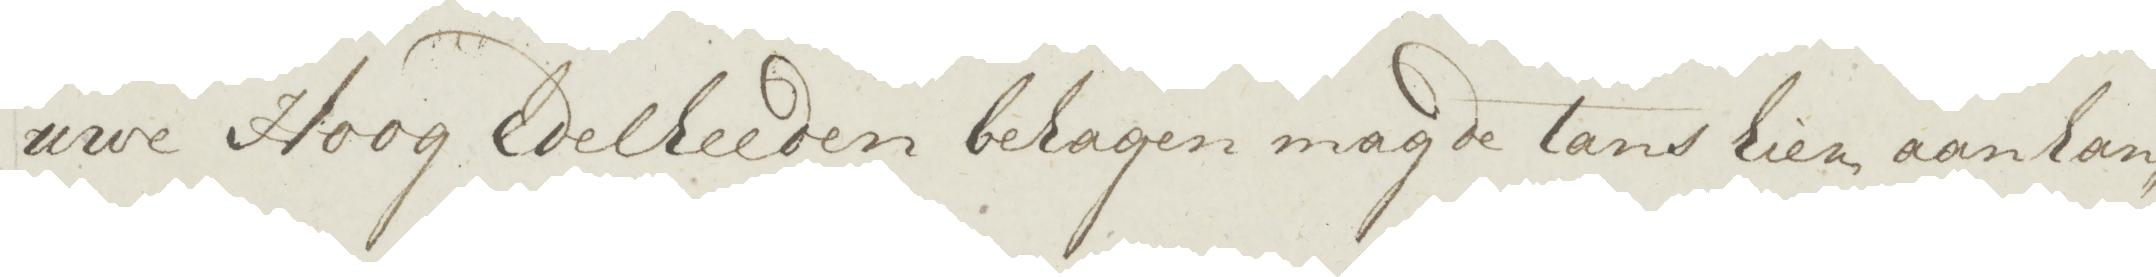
uwe Hoog Edelheeden behagen mag de tans hier aanhan
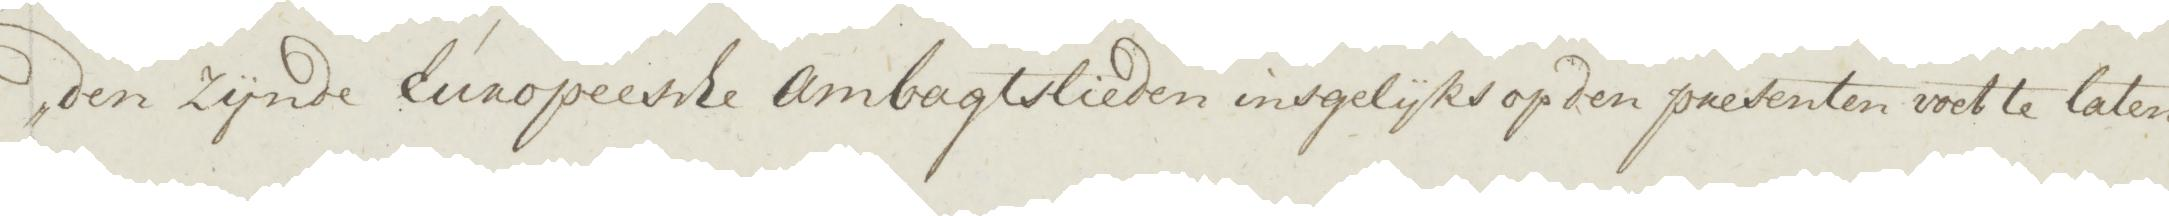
„den zijnde Europeesche ambagtslieden insgelijks op den presenten voet te laten.
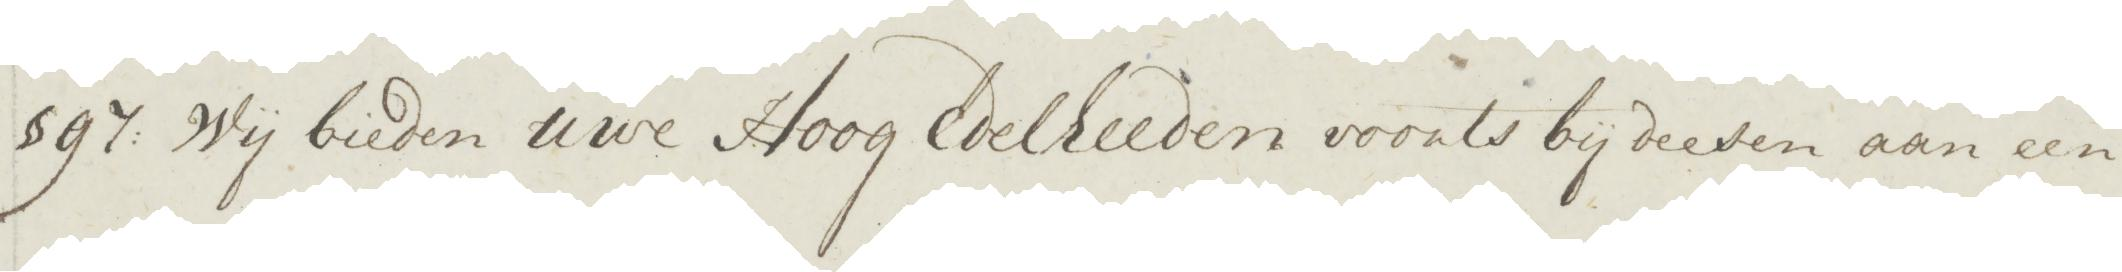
§ 97: Wij bieden uwe Hoog Edelheeden voorts bij deesen aan een
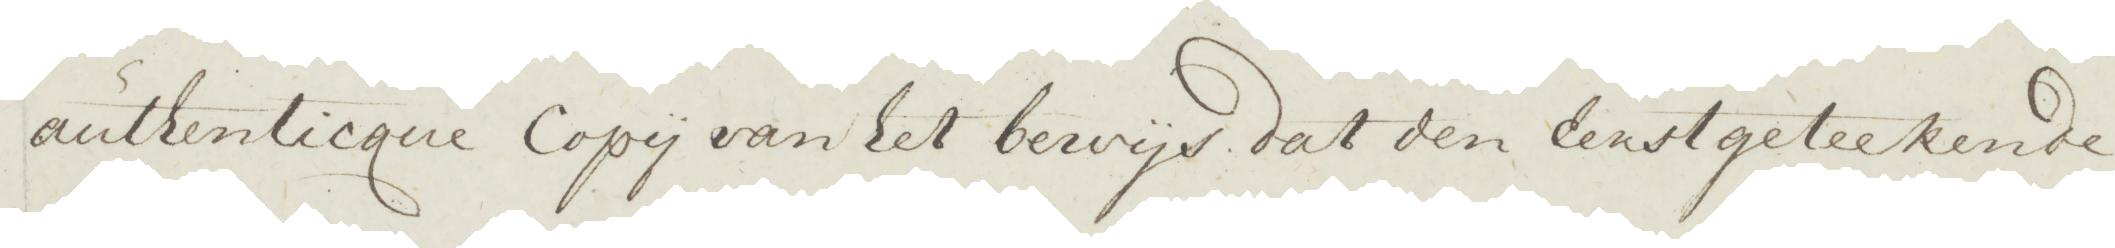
authenticque Copij van het bewijs dat den Eerstgeteekende
